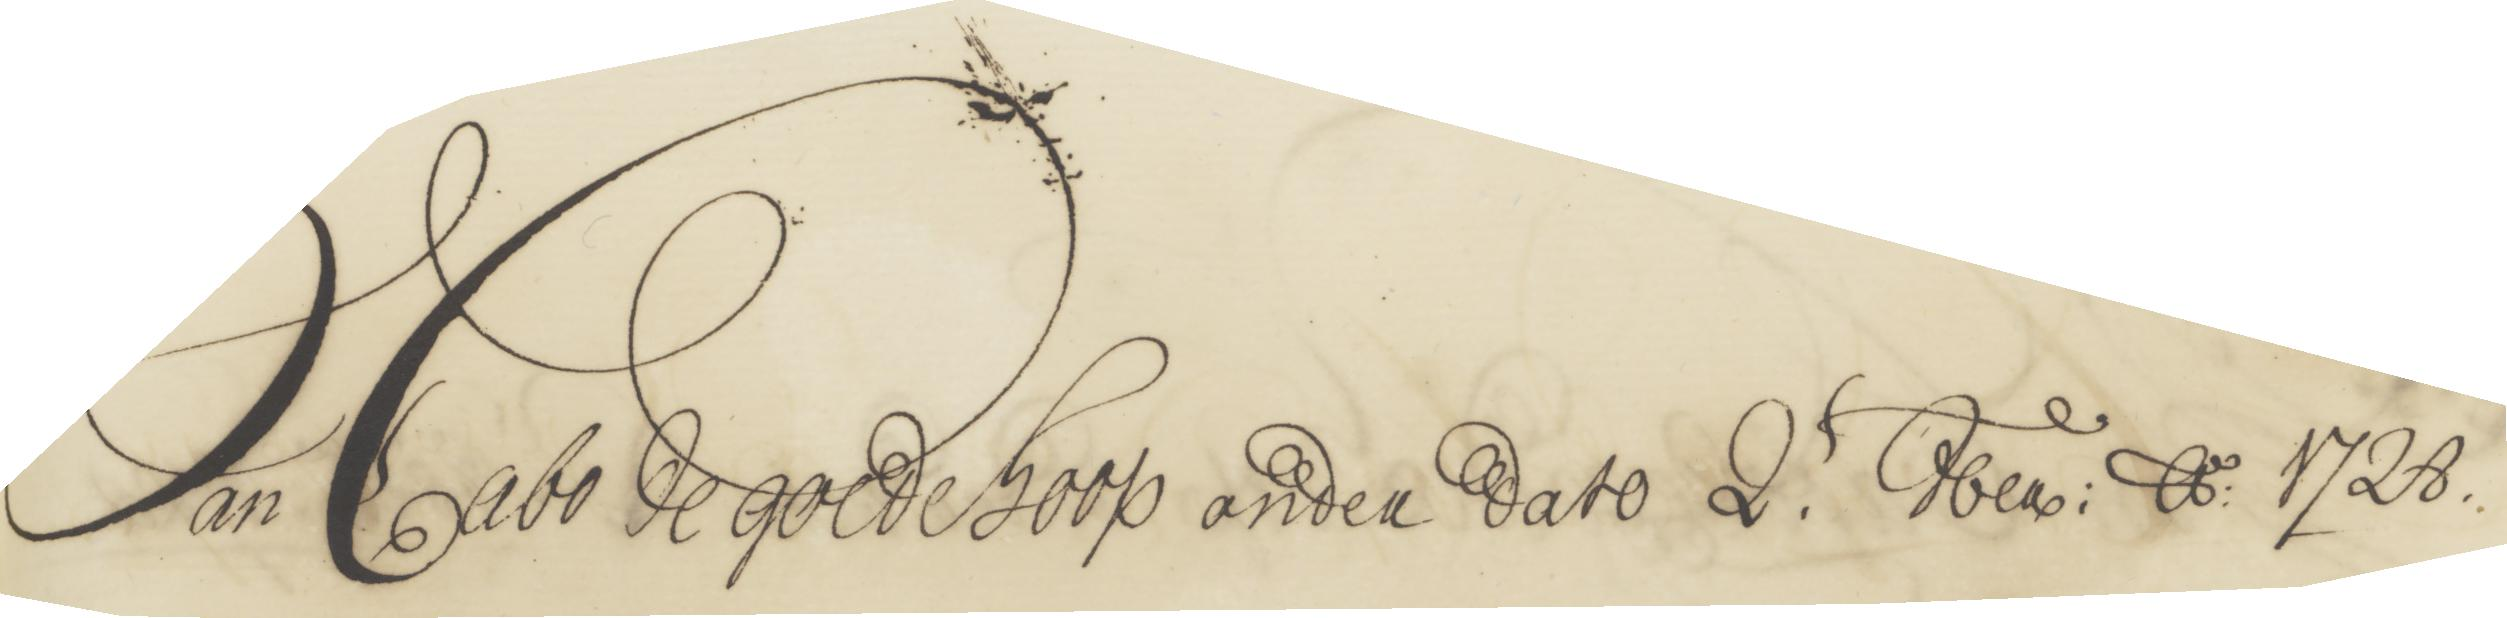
Van Cabo de goede hoop onder dato 2.' 9ber a:o 1728.
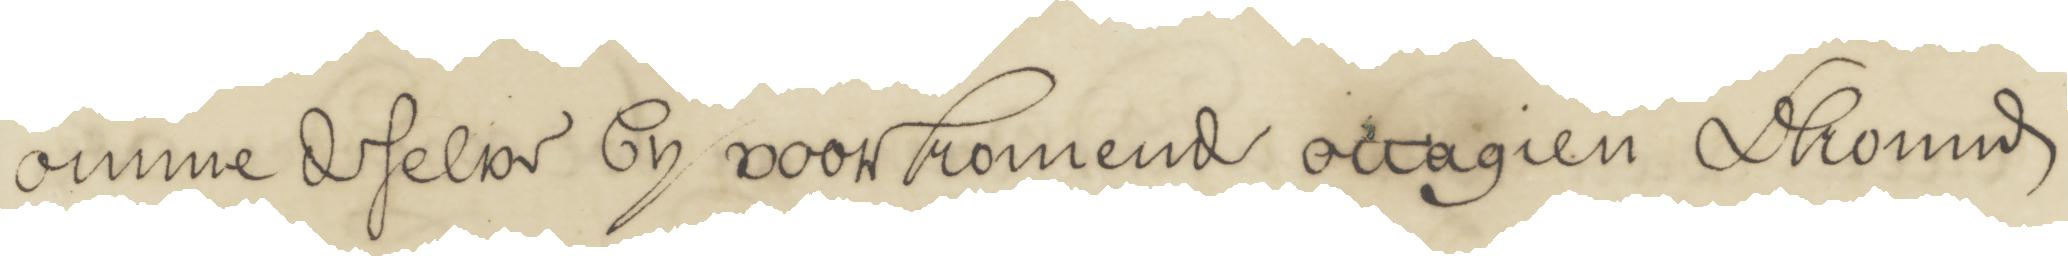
omme deselve by voorkomende occagien tekonnen
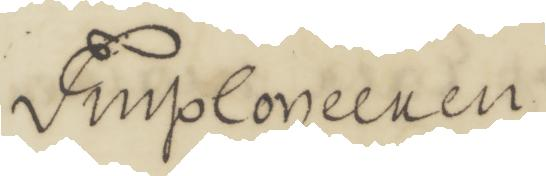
Employeeren
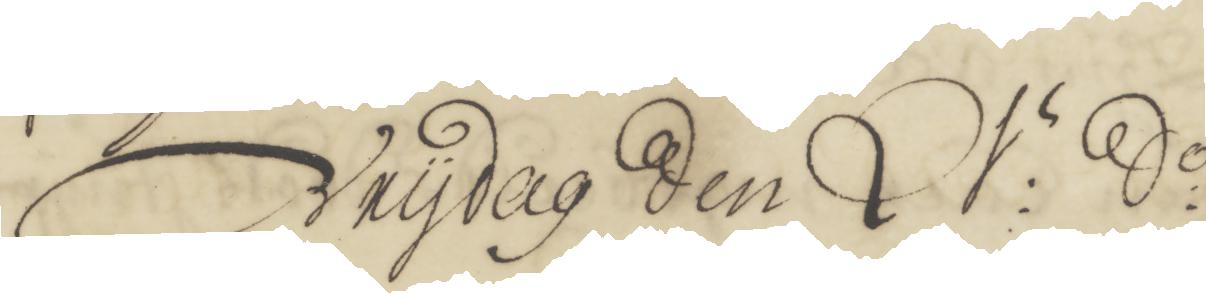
Vrijdag den 21:' d:o
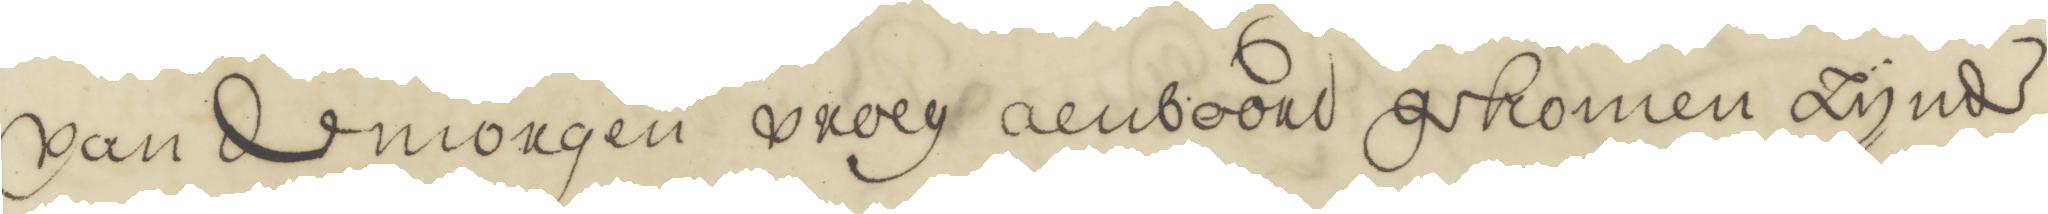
van de morgen vroeg aenboord gekomen zijnde,
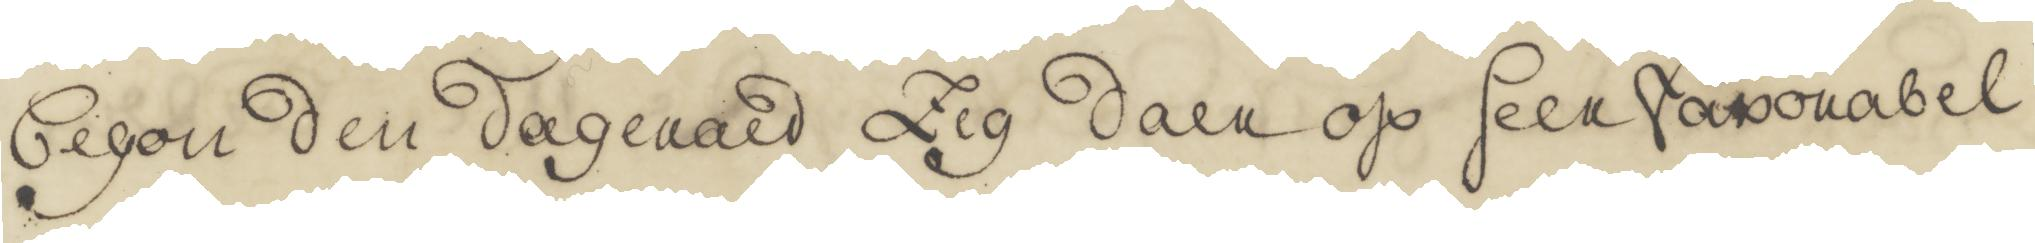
begon den dageraed zig daer op seer favorabel
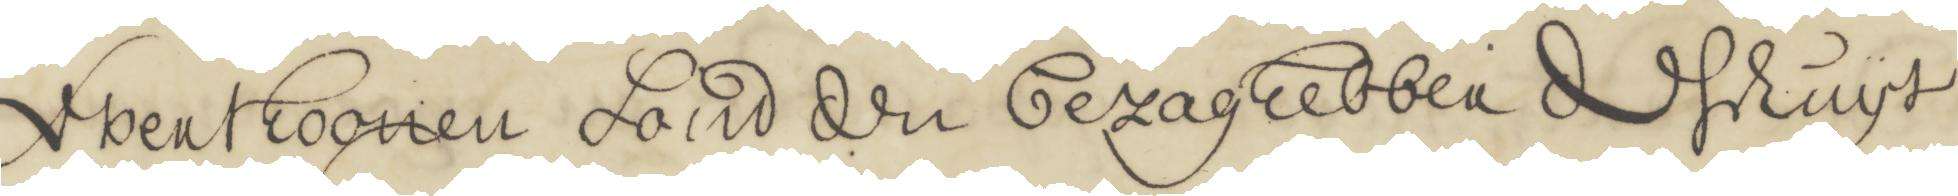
te verthoonen soud den bezaghebber de schuijt
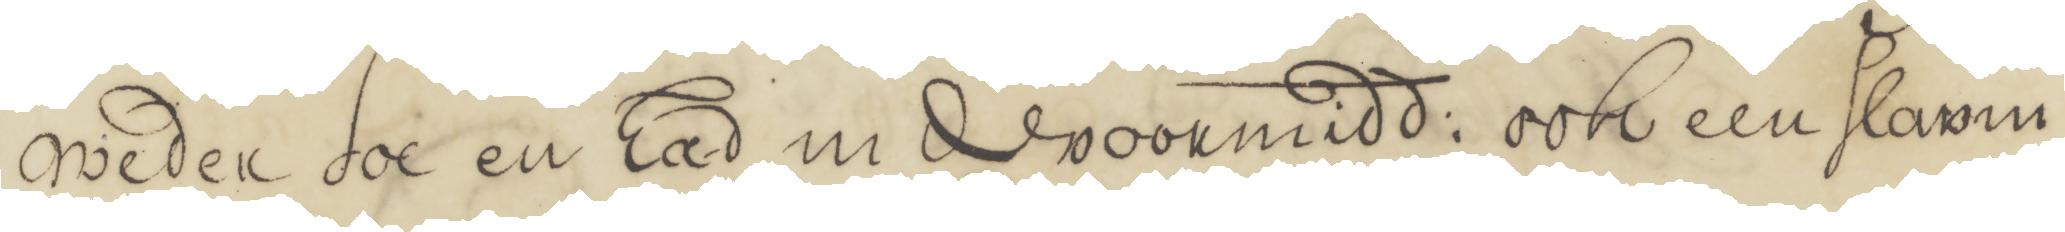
weder toe en had in de voormidd: ook een slavin
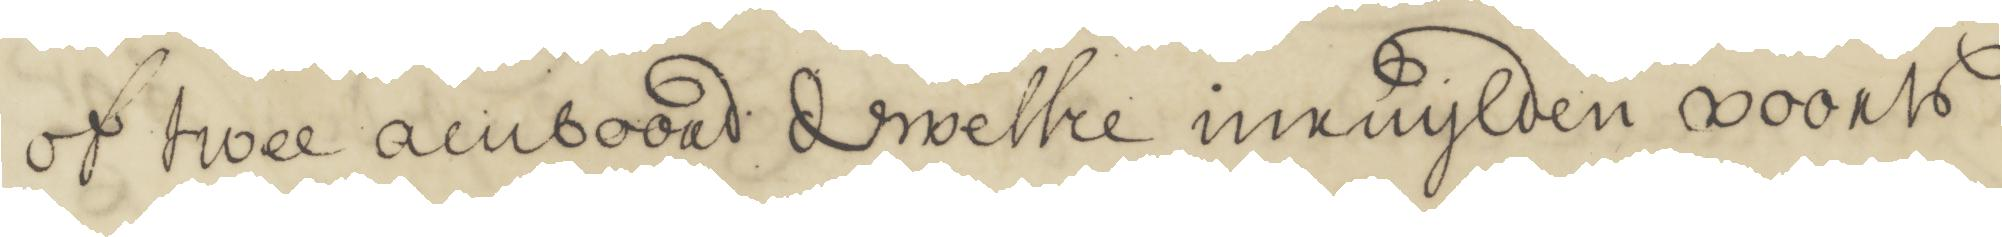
of twee aenboord dewelke inruijlden voorts
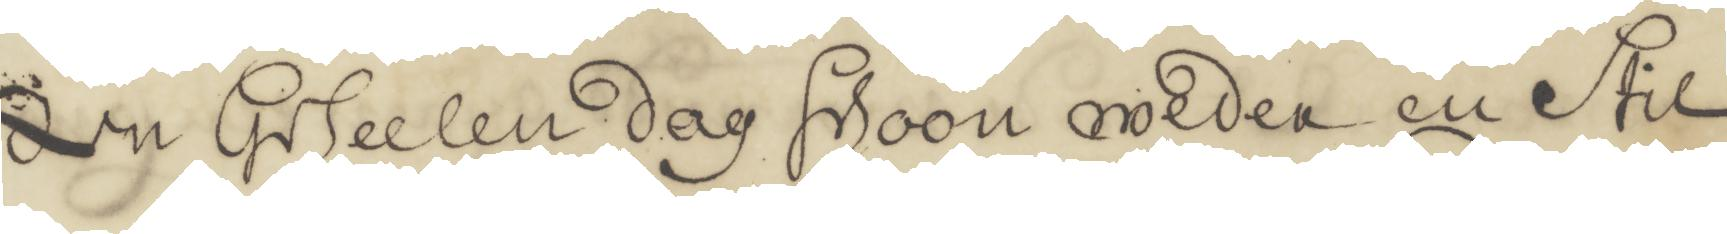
den Geheelen dag schoon weder en stil
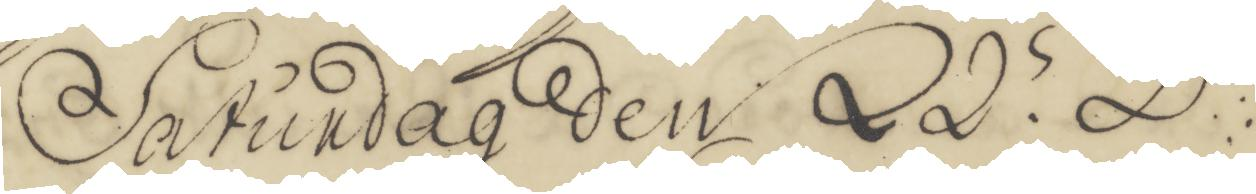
Saturdag den 22:' D:o
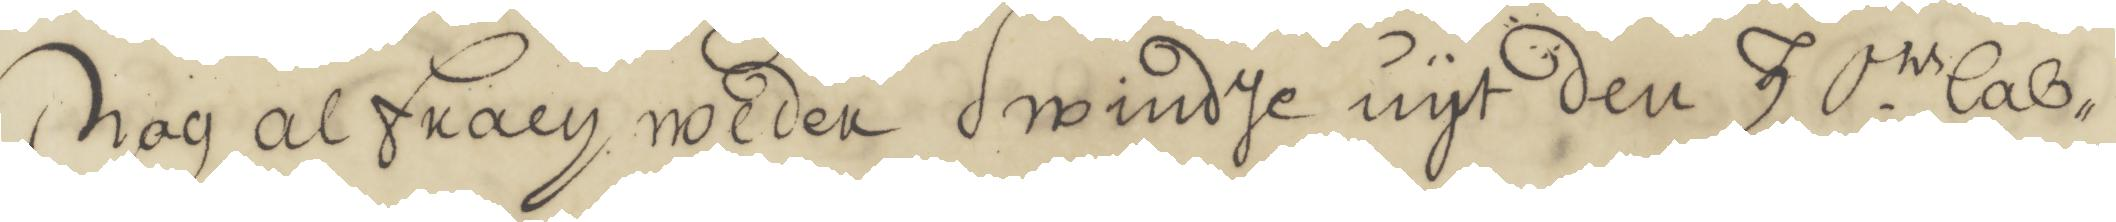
nog al fraey weder t windje uijt den Z O.ten lab„
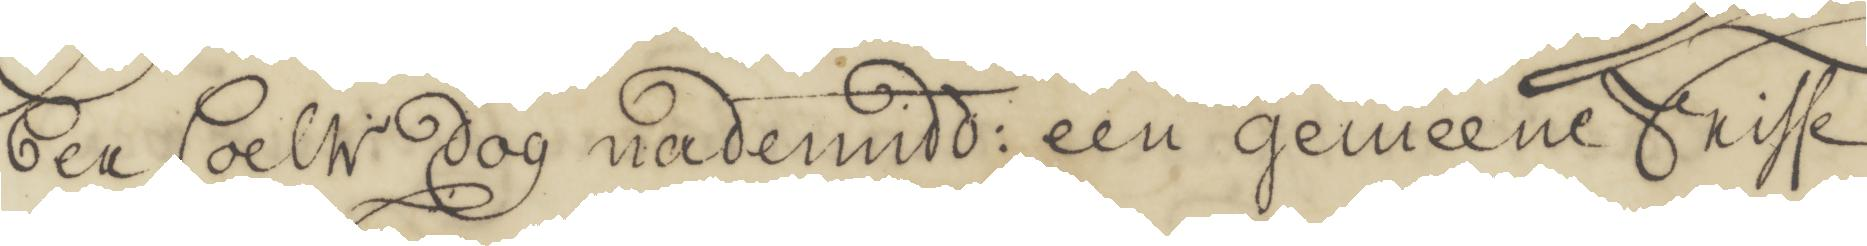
ber Coelte dog nademidd: een gemeene frisse
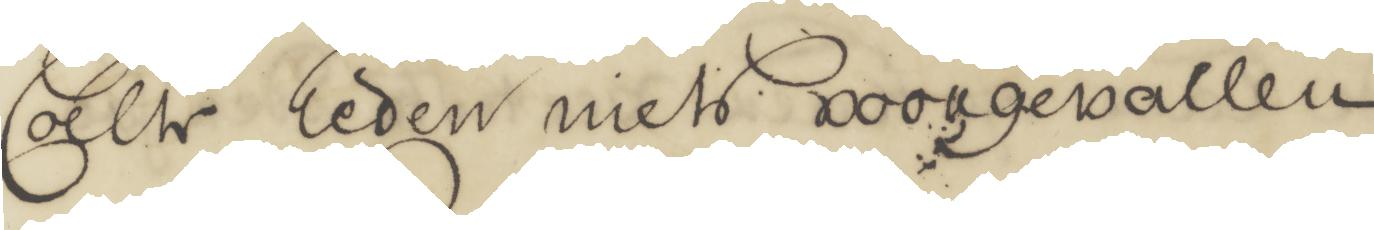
Coelte heden niets voorgevallen
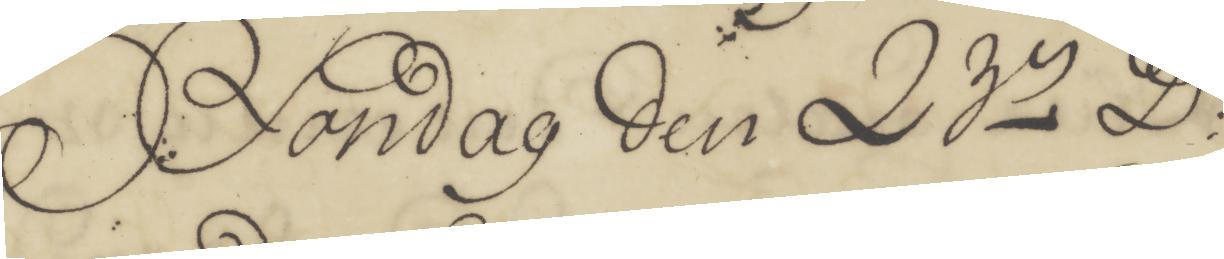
Sondag den 23-e D:o
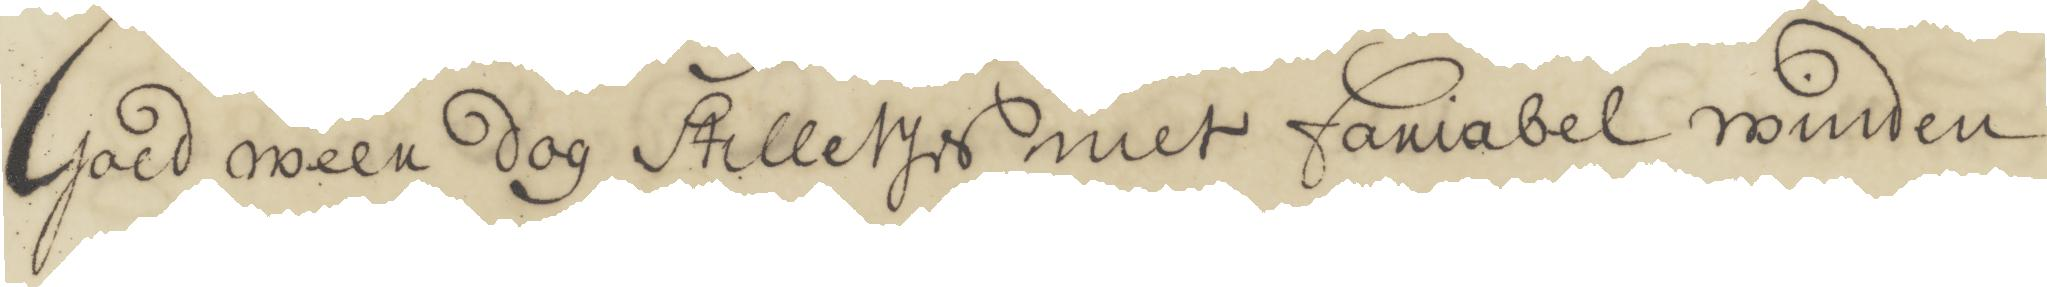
Goed weer dog stilletjes met fariabel winden
